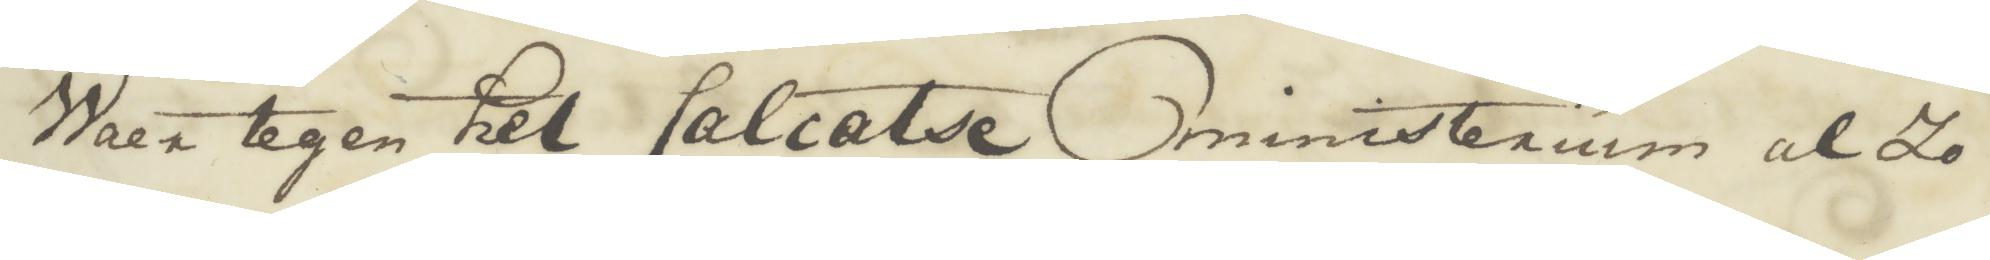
Waer tegen het Calcatse ministerium al zo
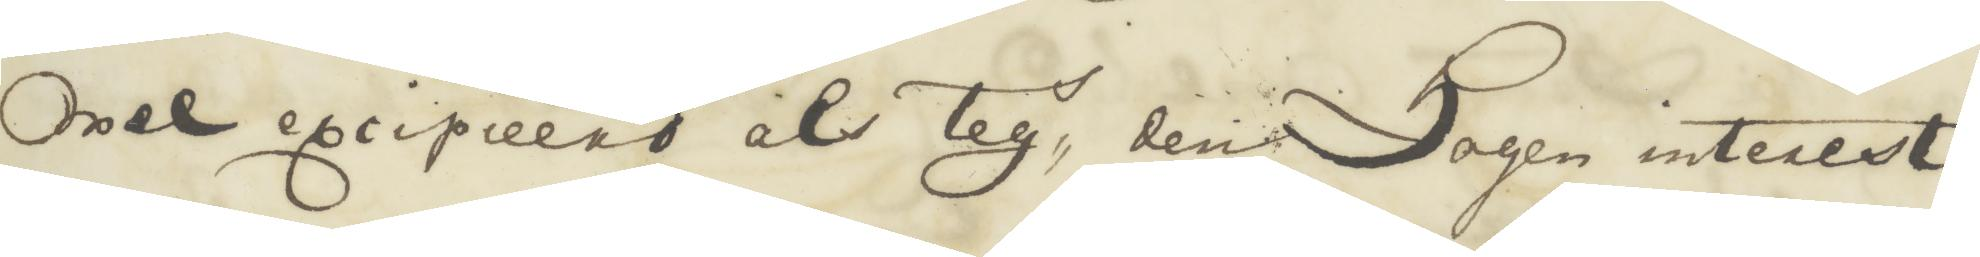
wel excipieerd als teg„s den Hogen interest
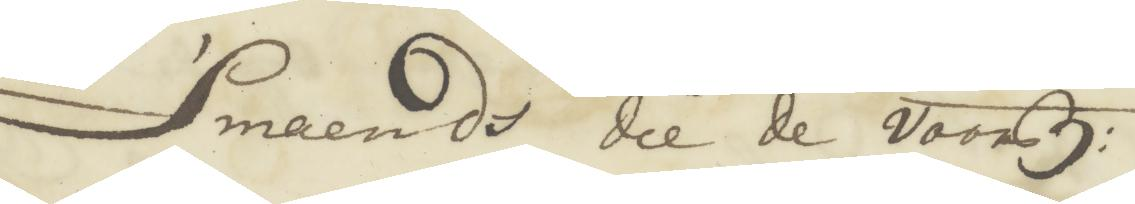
van een percento 'Smaends die de voorsz:
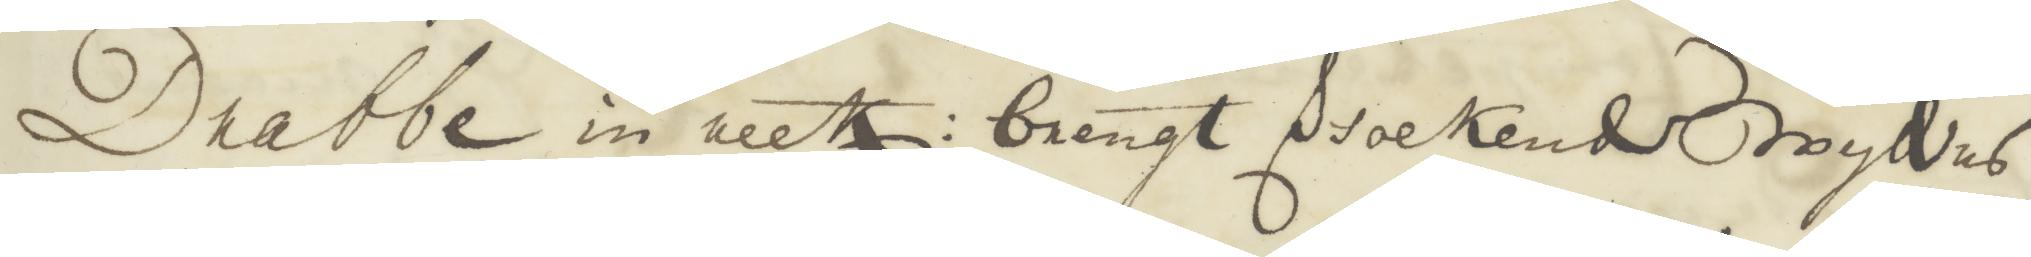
Drabbe in reek: brengt versoekende wijders
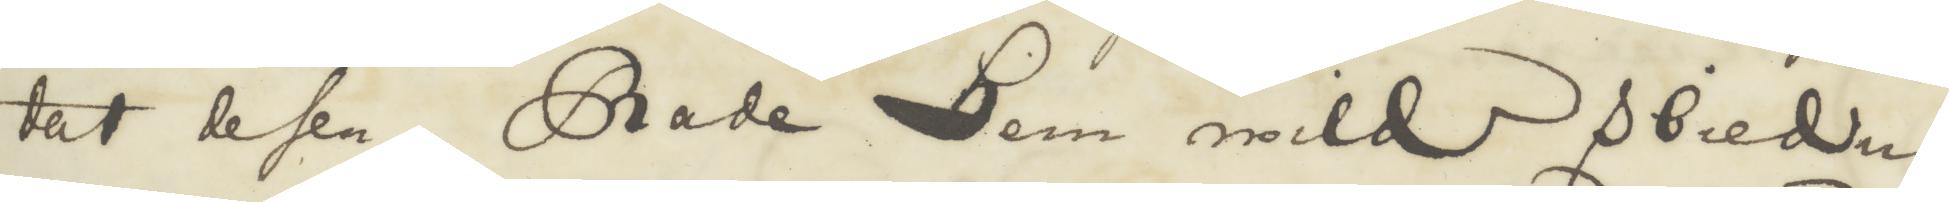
dat desen Rade hem wilde verbieden
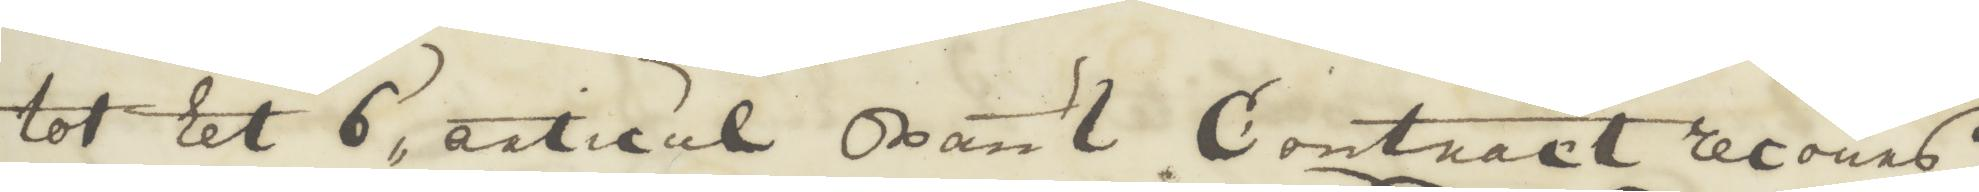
tot het 6„' articul van’t Contract recours
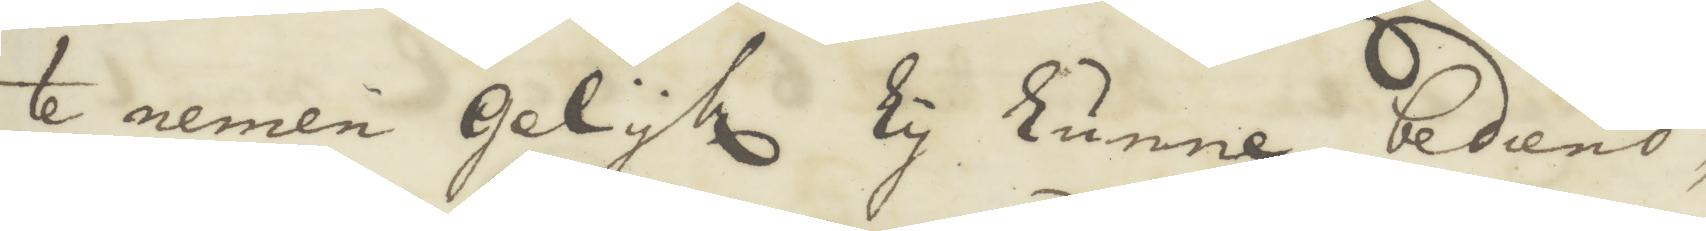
te nemen gelijk hij hunne bediend„s ge„
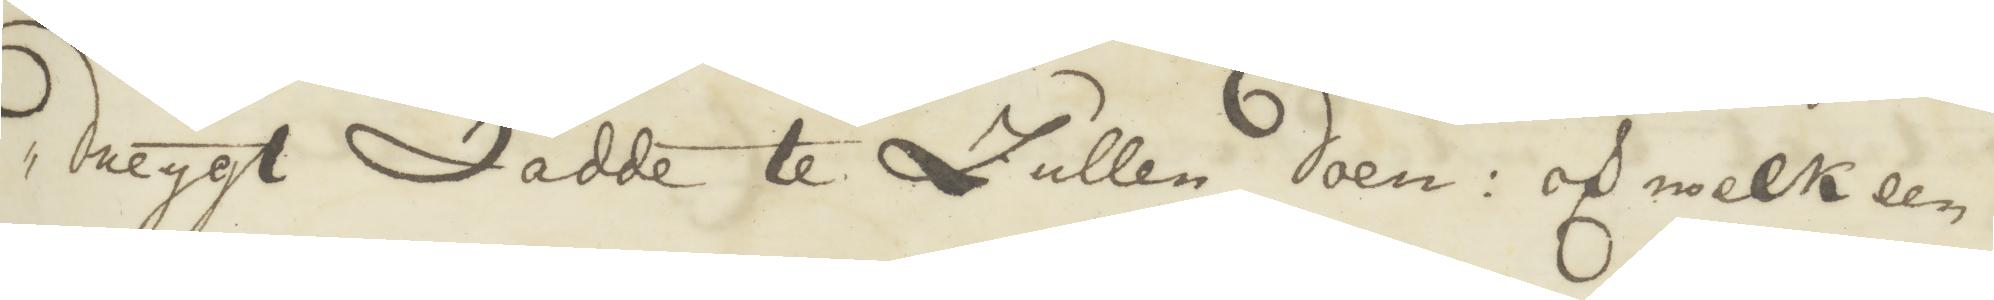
„dreijgt Hadde te zullen doen: over welk een
